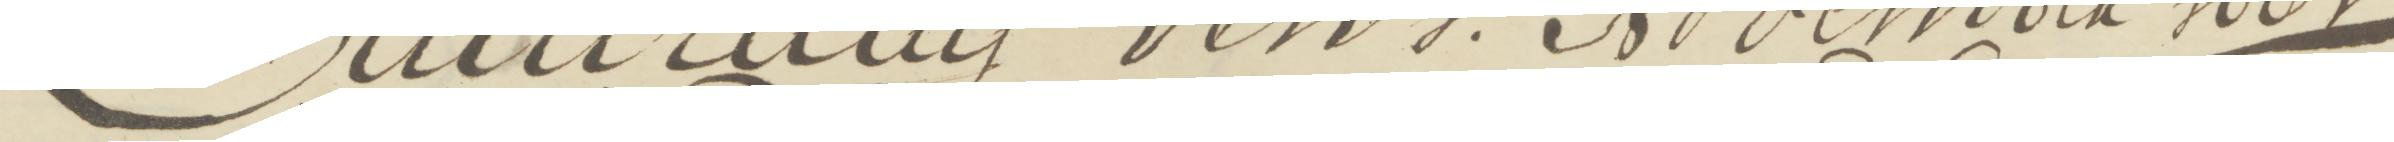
Saturdag den 1: November 1681
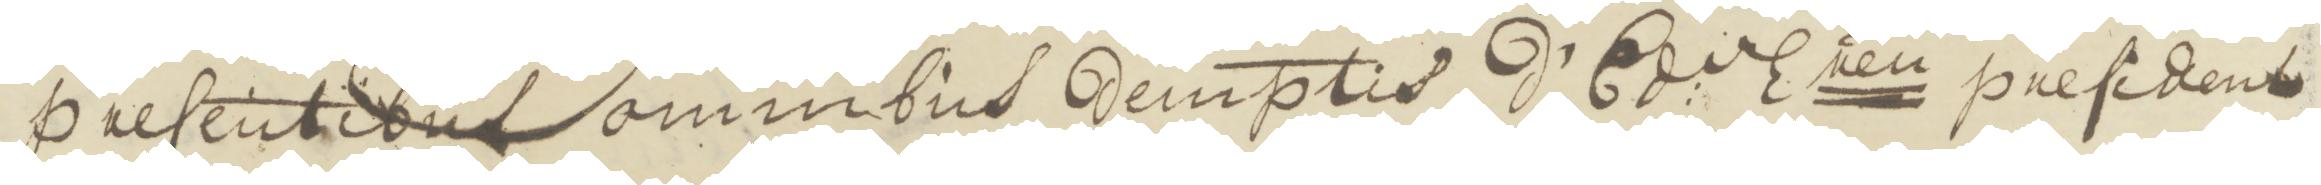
presentibus omnibus demptis d’ Ed:e h=ren president
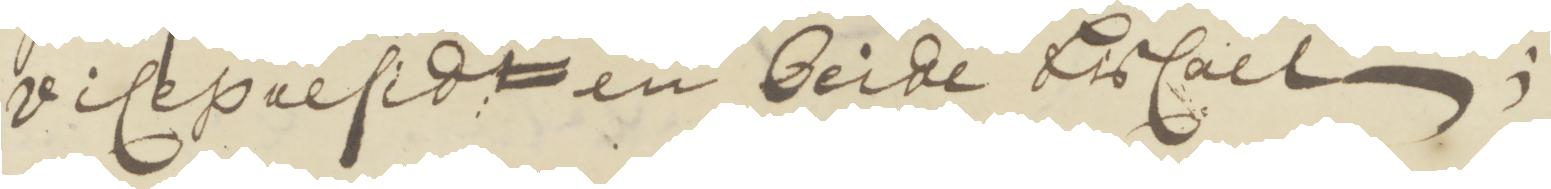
vicepresid:t en beide fiscaelen;
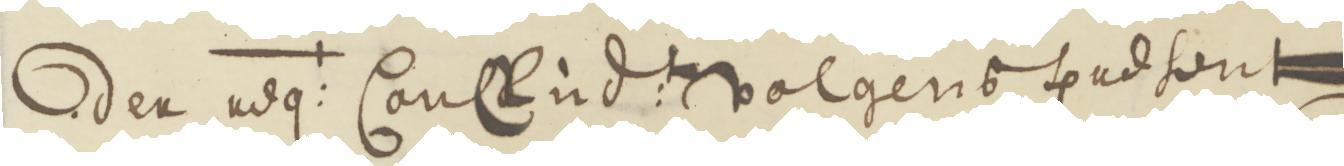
der reg:t Conclud:t volgens present
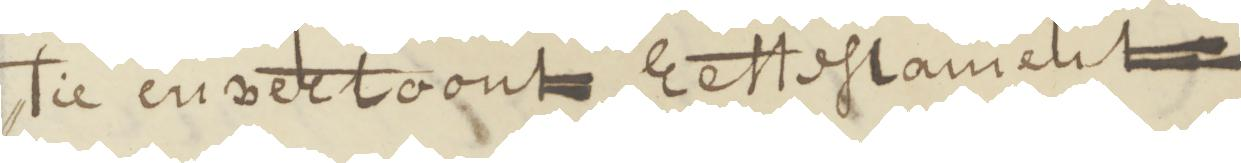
„tie en vertoont het testament
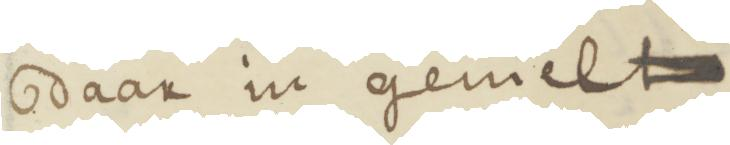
daar in gemelt
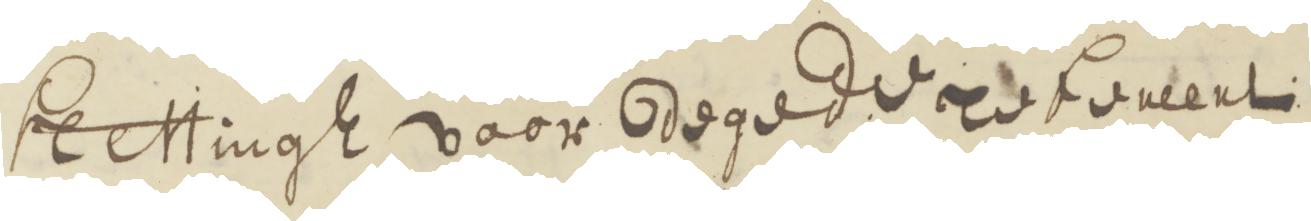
Kettingh voor de ged:e refereert
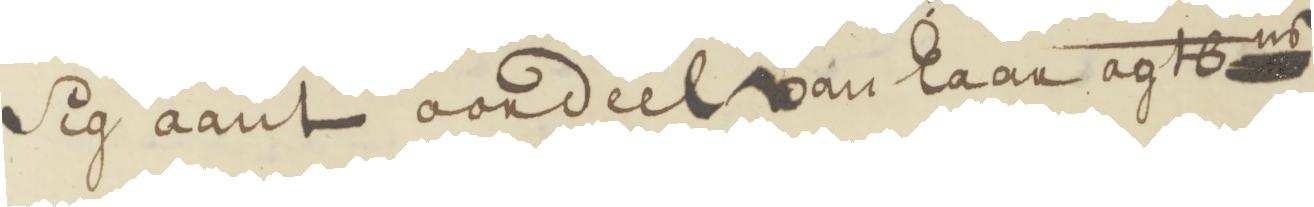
sig aan't oordeel van haar agtb=ns
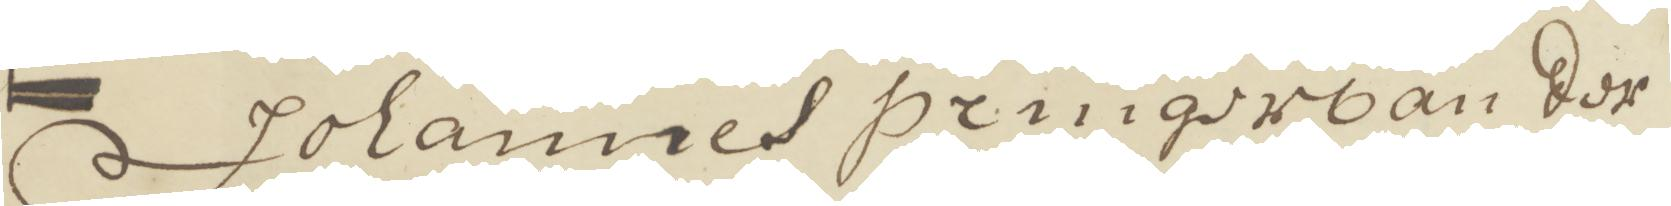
Johannes Pringer van der
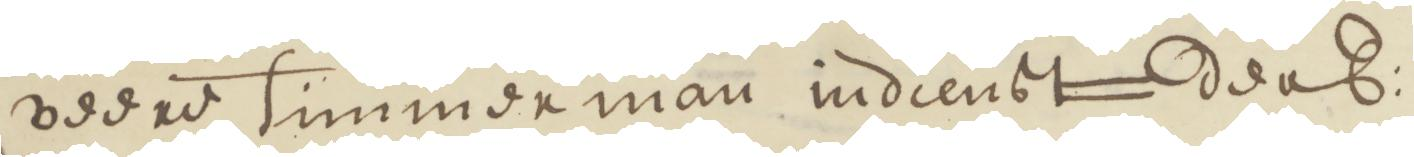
veere Timmerman in dienst der E:
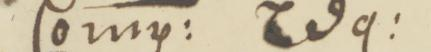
Comp: req:t
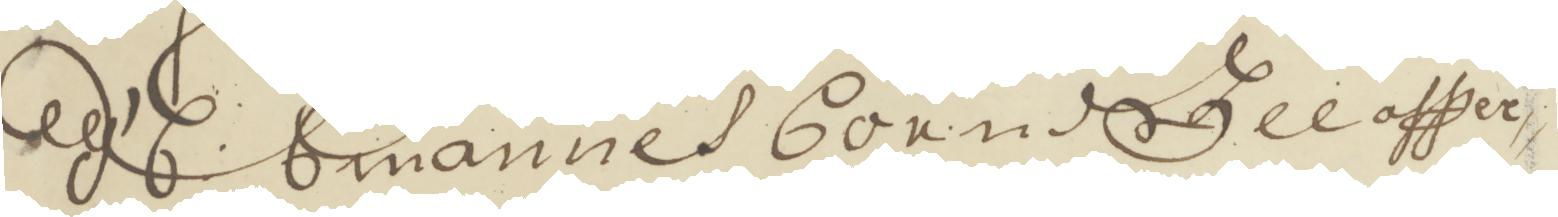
d' E: Emanues Corne Zee opper„
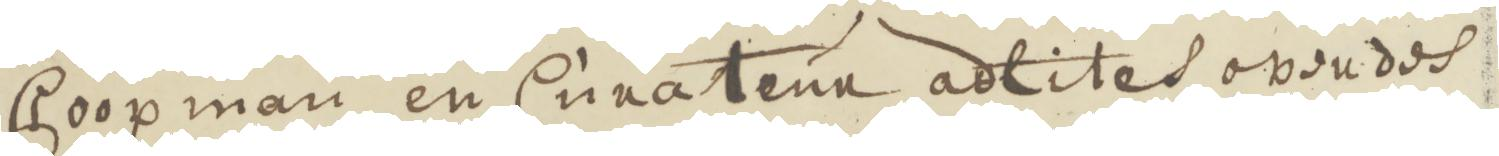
Coopman en Curateur adlites over des
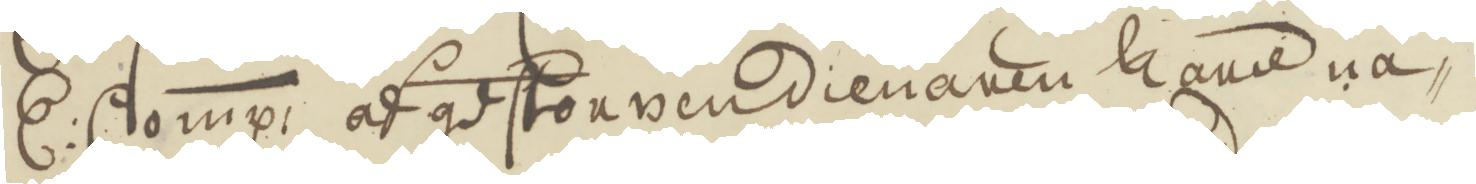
E: Comp: af gestorven dienaren hare na„
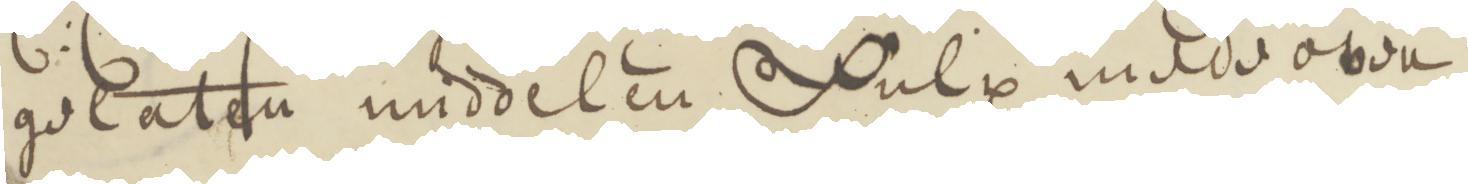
gelaten middelen Sulx mede over
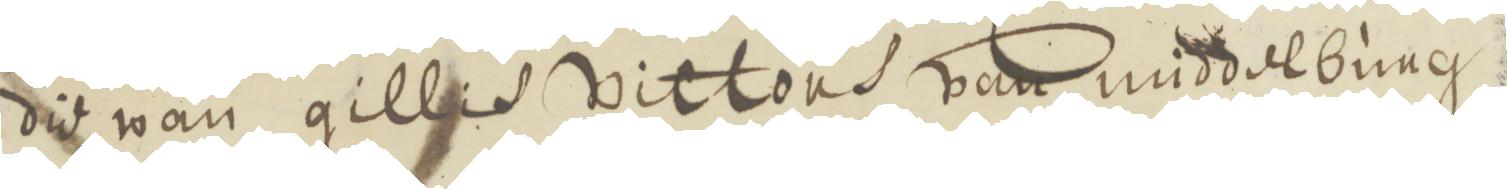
die van gillis victors van middelburg
